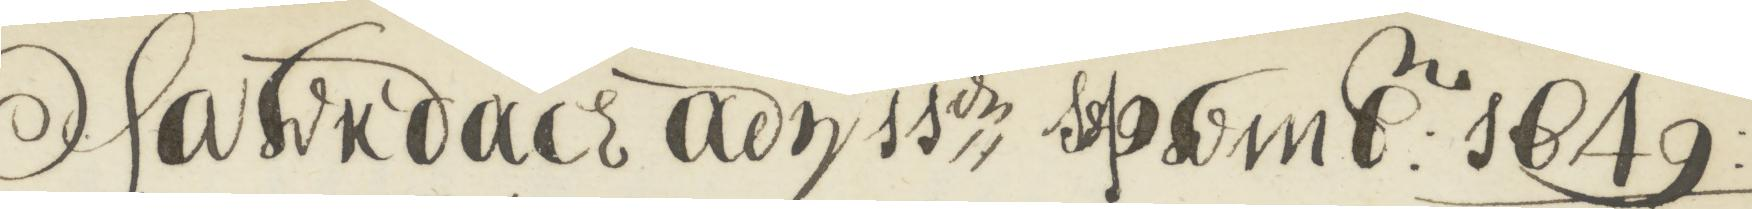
Saterdach den 11„en Septemb:r 1649:
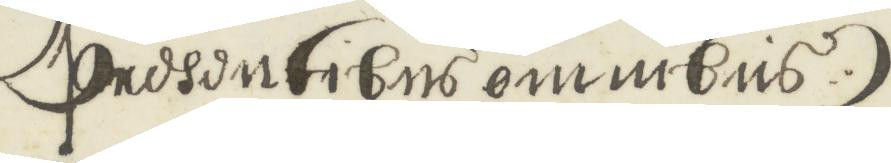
presentibus omnibus:
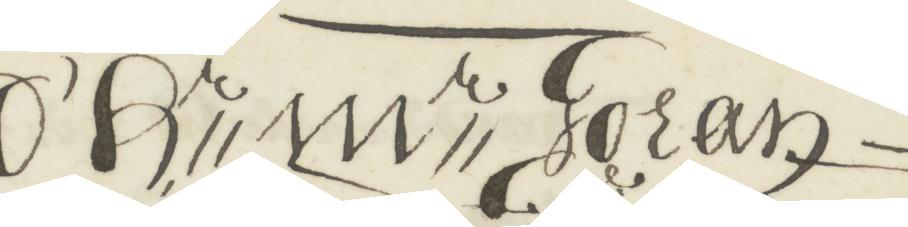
D H„r m„r Ioran
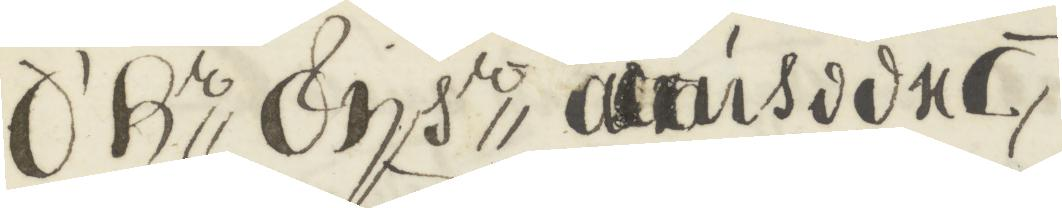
d h„r Eijs„r accuseert,
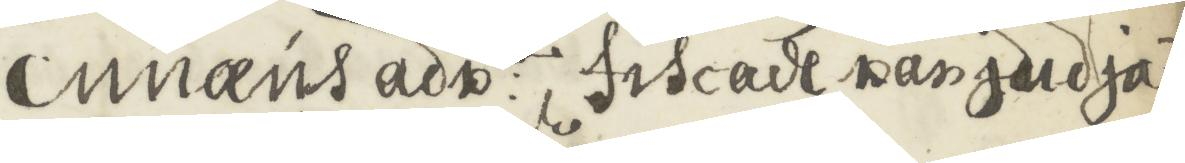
cnuoeus adv:t Fiscael van jndja
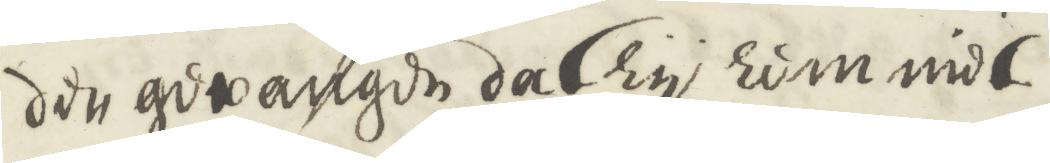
den gevangen dat hij hem niet
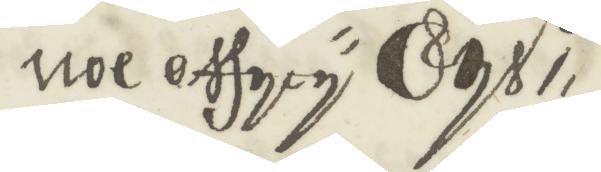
noe offijcij Eys„r
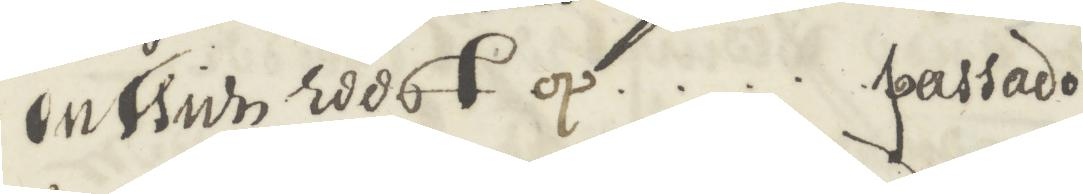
ontsien heeft op - - - - - passado
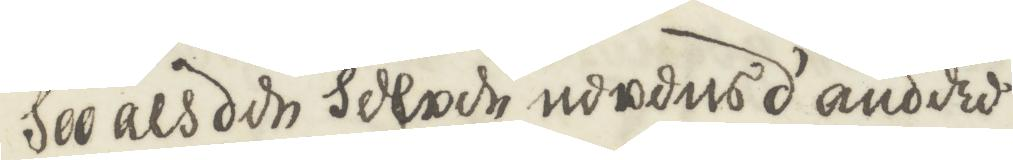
soo als den selven nevens d’ andere
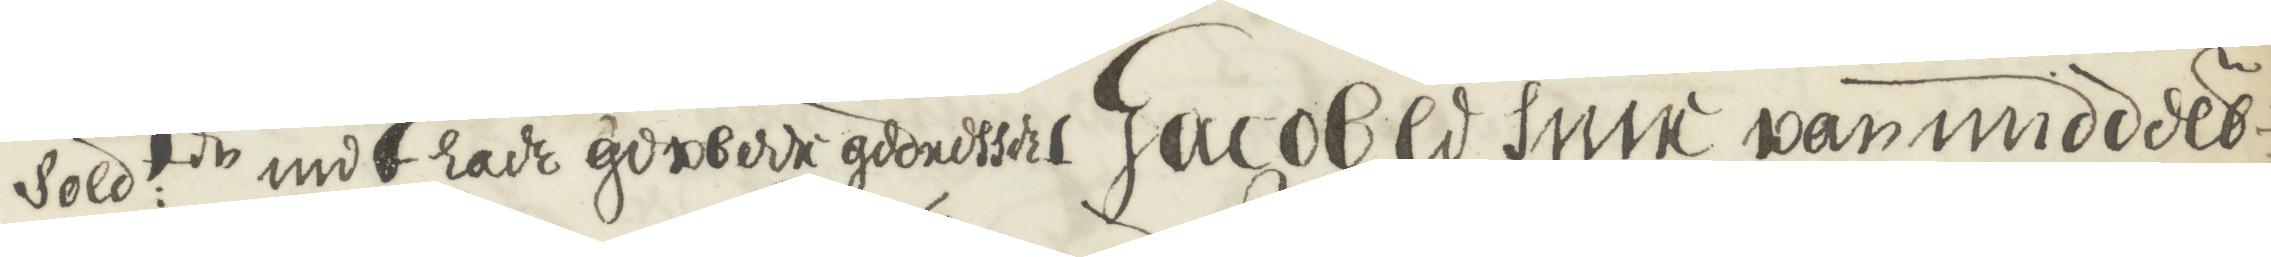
sold:ten met haer geweer gedresseert Jacob le suir van middelb=
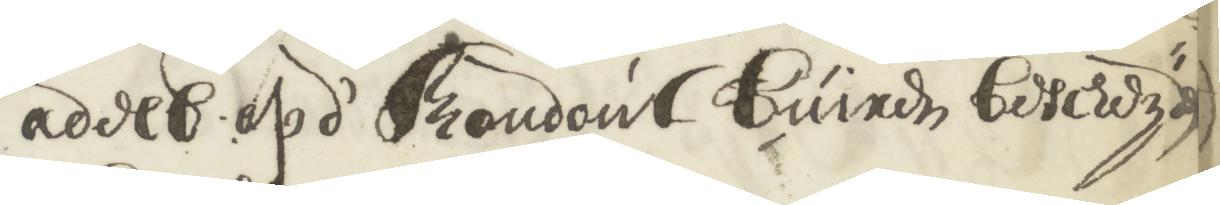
adelb:n op d’ Trondout buiren bescheijden
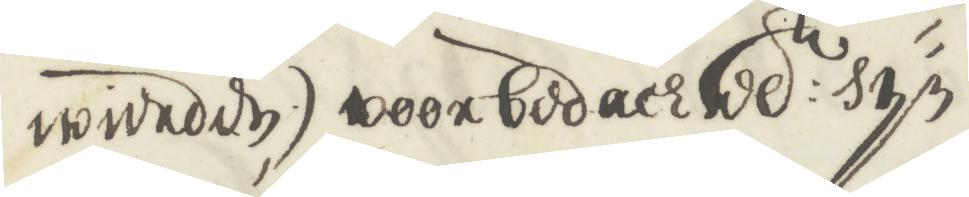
wierden) voor bedachtel:n sijn
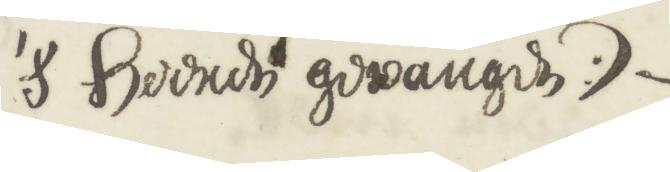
's Heeren gevangen:) —
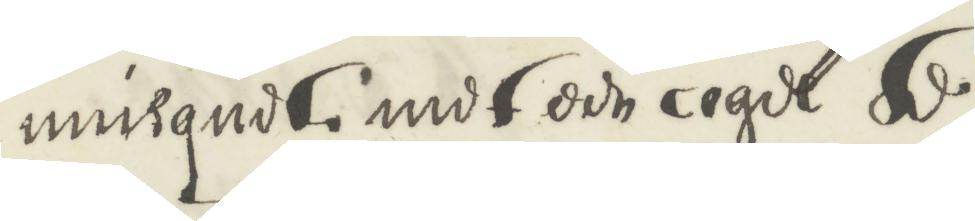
musquet met een cogel te
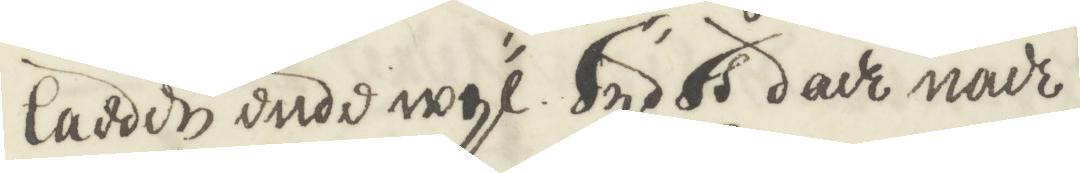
laeden ende wijl tijdss daer naer
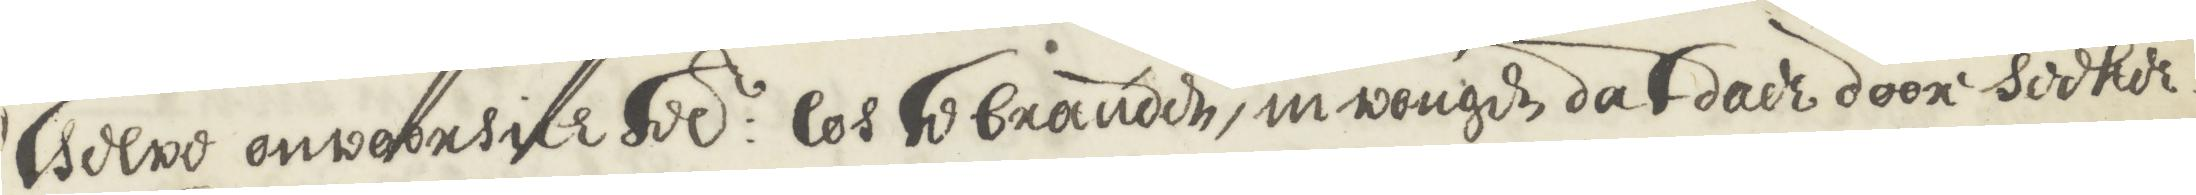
'tselve onvoorsichtel: los te branden, in vougen dat daer door seeker
